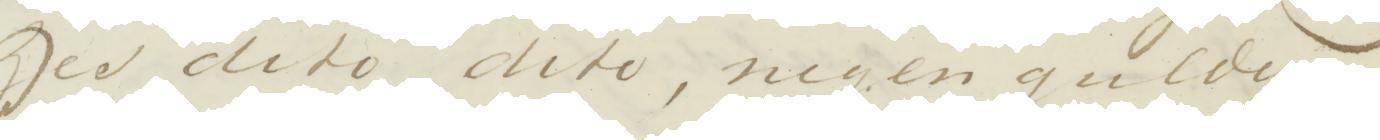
Zes dito, dito, negen guldens.
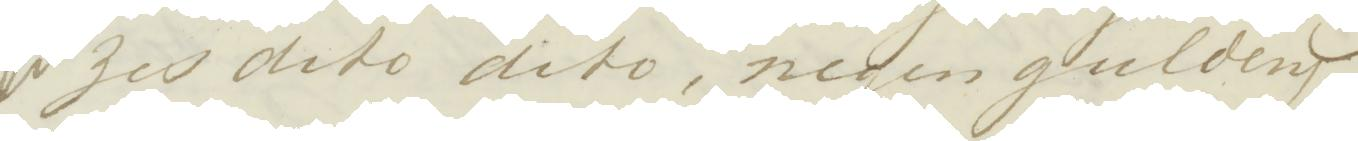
Zes dito dito, negen guldens
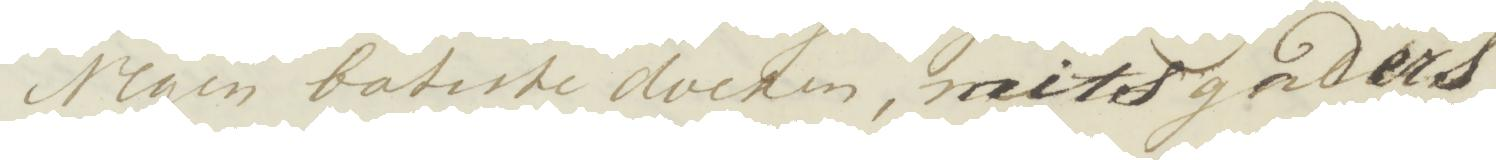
Negen batiste doeken, mits gaders
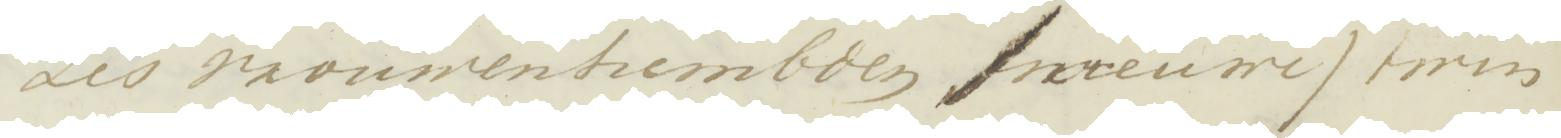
zes Vrouwenhembden /naeuwe/ twin
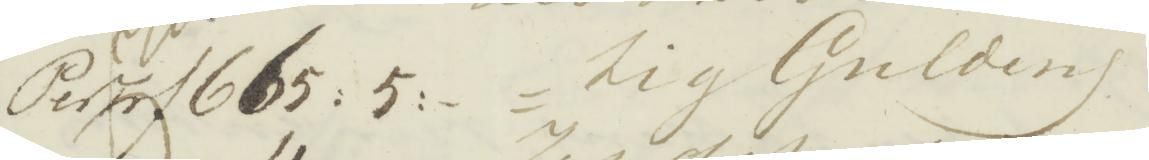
Per Tr ƒ665: 5: - =tig Guldens
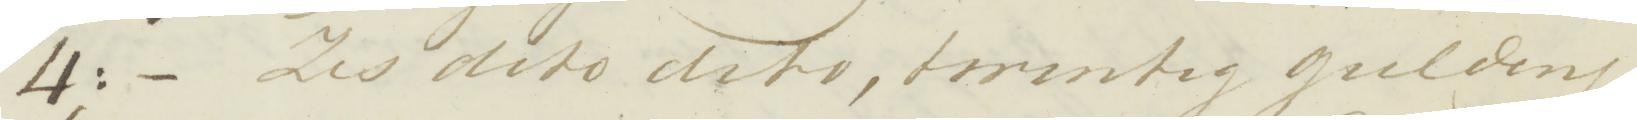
4: – Zes dito dito, twintig guldens
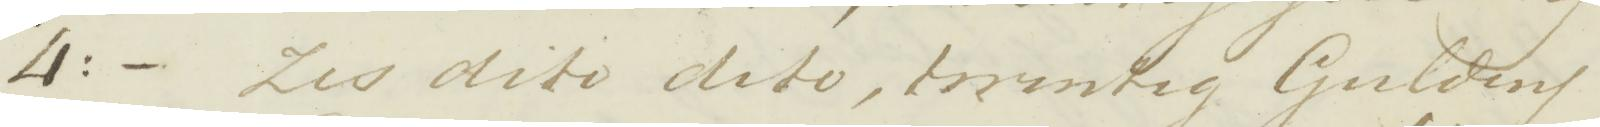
4: – Zes dito dito, twintig Guldens
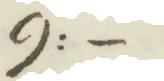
9: –
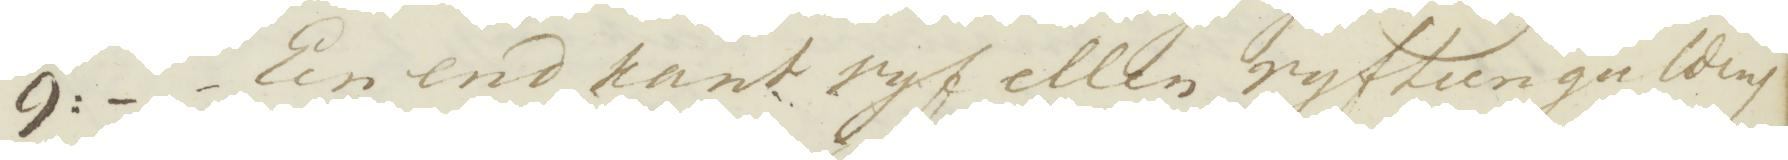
9: – – Een end kant vyf ellen vyftien guldens
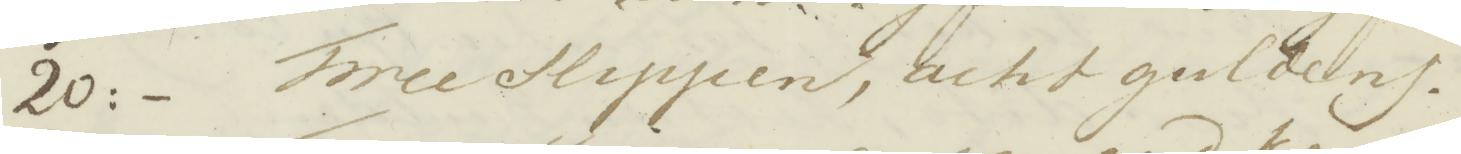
20: – Twee slippen, acht guldens.
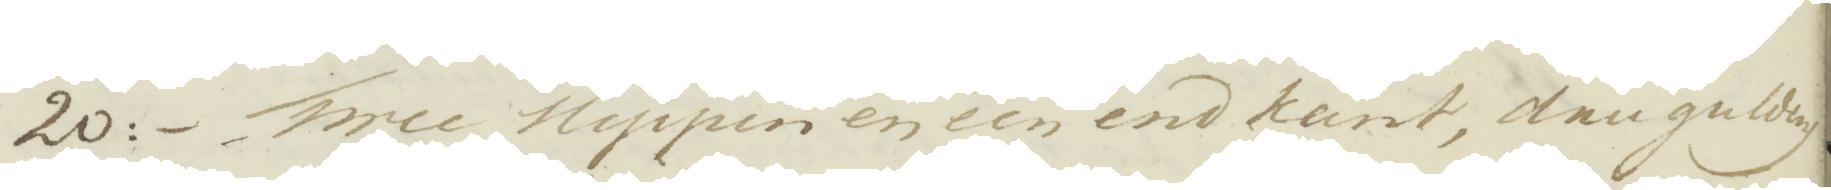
20: – twee slippen en een end kant, drie guldens
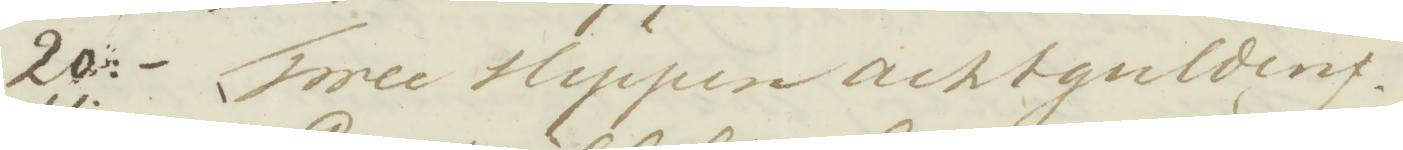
20: – Twee slippen acht guldens.
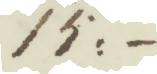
15: –
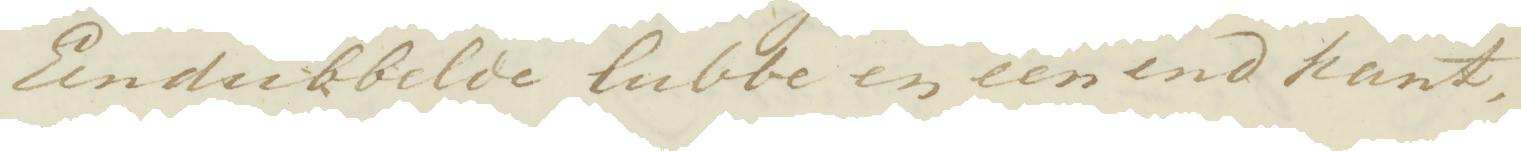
Een dubbelde lubbe en een end kant,
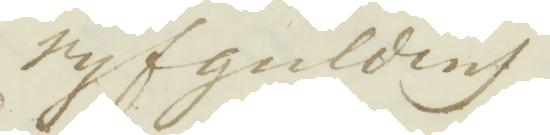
vyf guldens
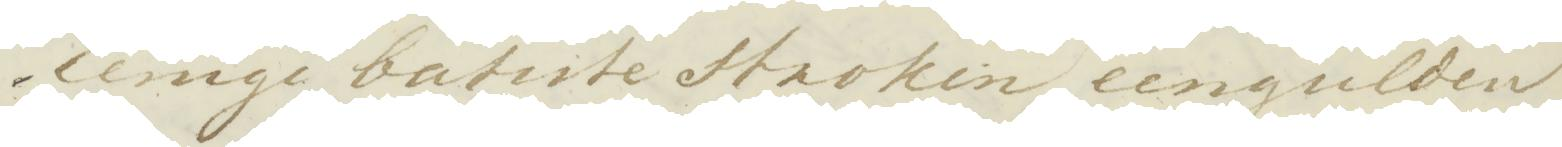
– Eenige batiste stroken, een gulden
